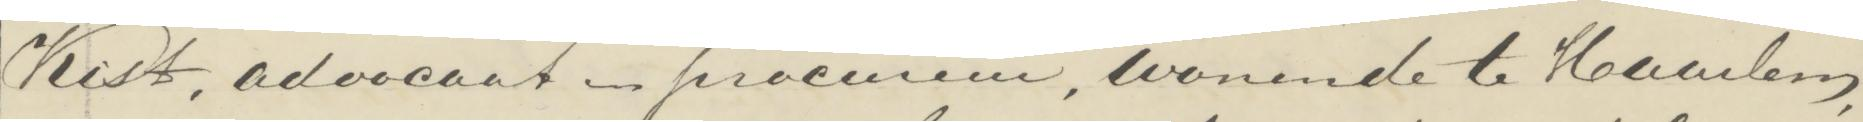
Kist, advocaat en procureur, wonende te Haarlem,
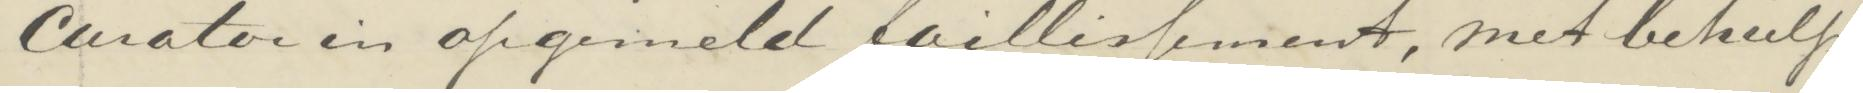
Curator in opgemeld faillissement, met behulp
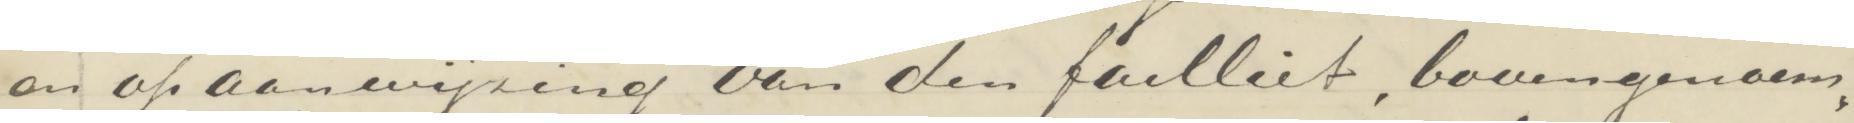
en op aanwijzing van den failliet, bovengenoem„
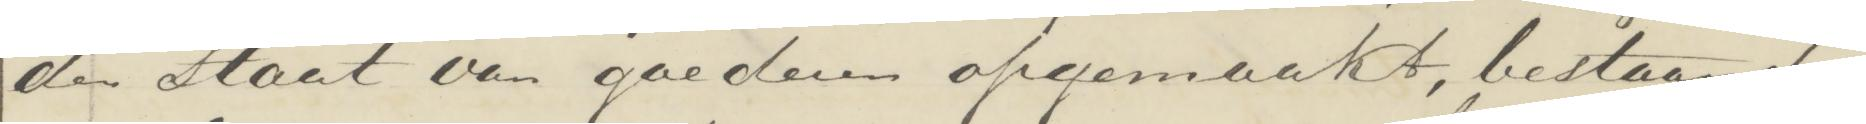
den staat van goederen opgemaakt, bestaande
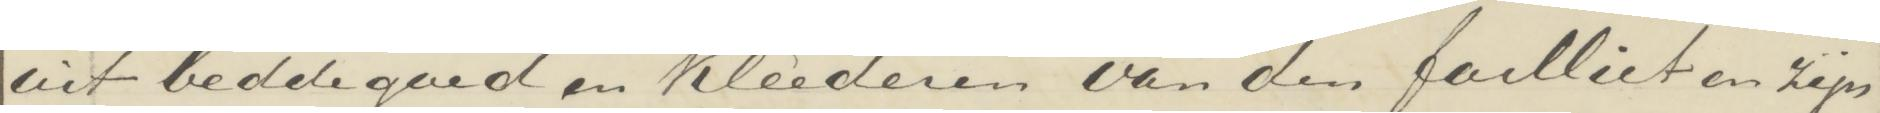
uit beddegoed en kleederen van den failliet en zijn
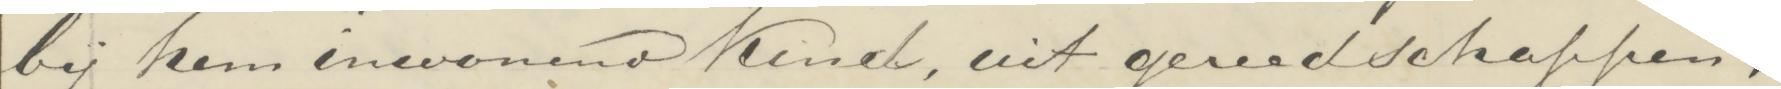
bij hem inwonend kind, uit gereedschappen,
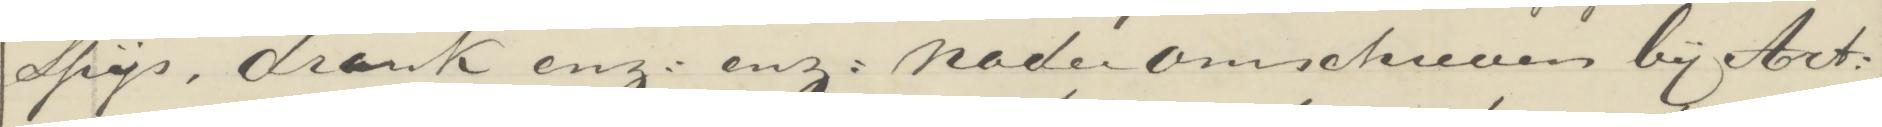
spijs, drank enz: enz: nader omschreven bij Art:
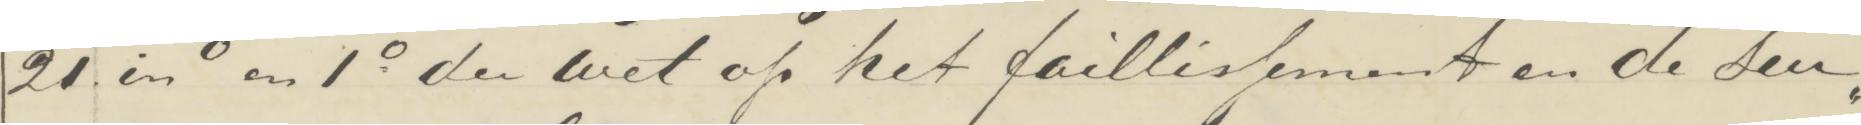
21. in o en 1=o der wet op het faillissement en de sur„
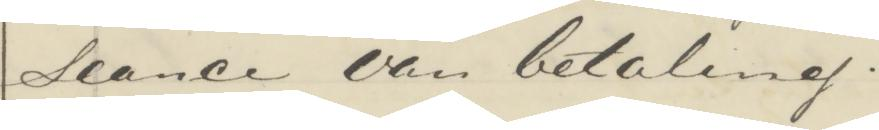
seance van betaling.
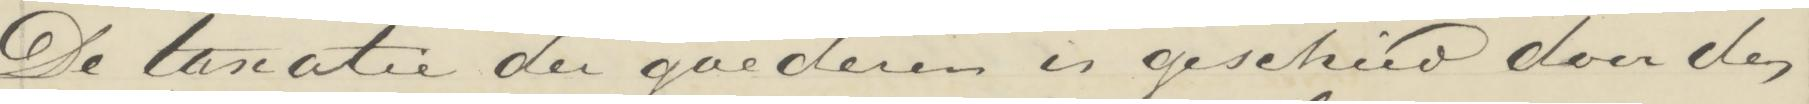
De taxatie der goederen is geschied door den
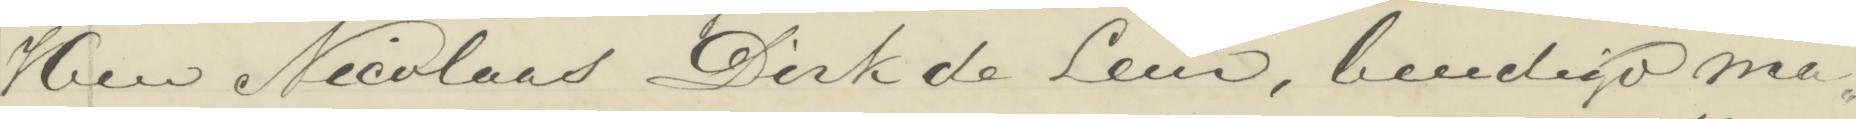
Heer Nicolaas Dirk de Leur, beeedigd ma„
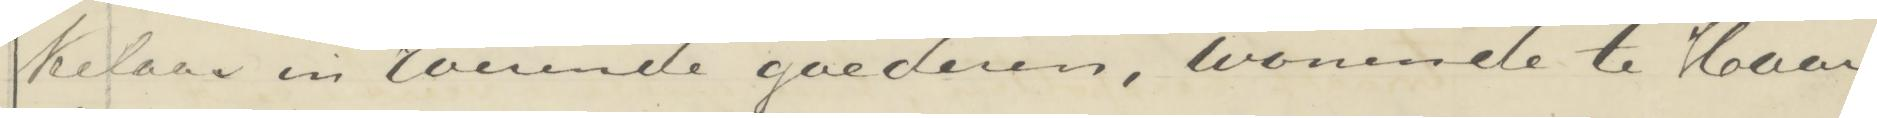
kelaar in roerende goederen, wonende te Haar
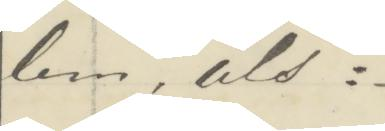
lem, als:
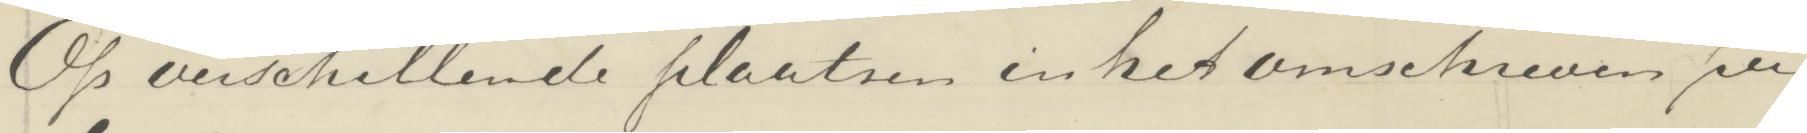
Op verschillende plaatsen in het omschreven per
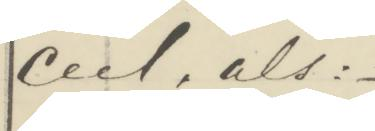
ceel, als:
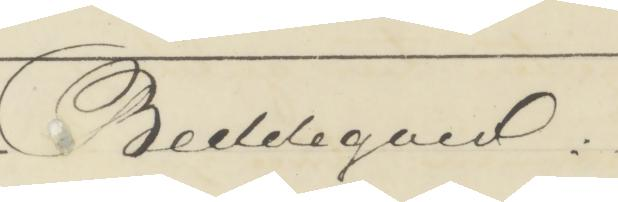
Beddegoed:
